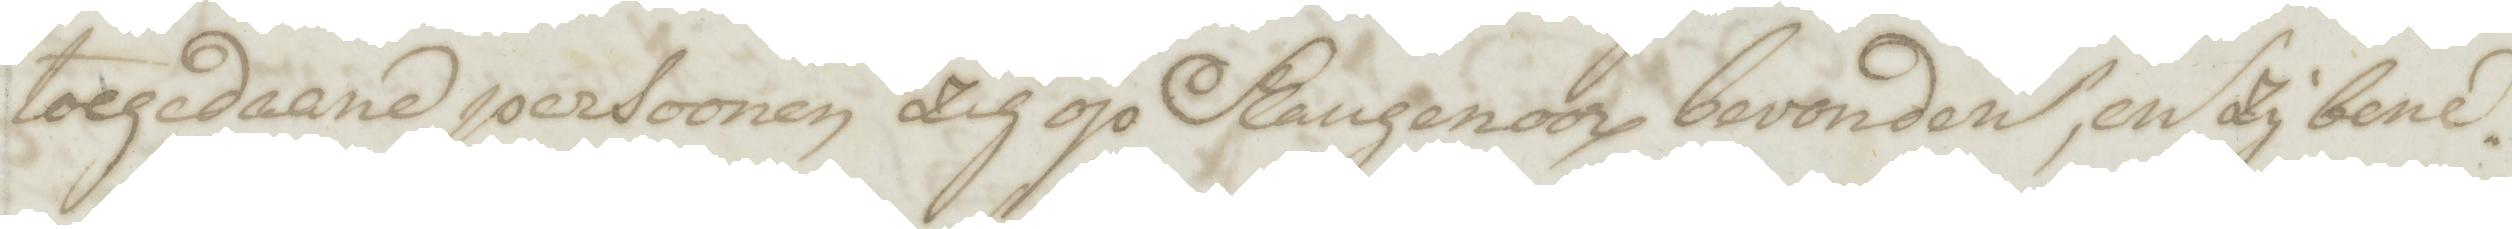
toegedaane persoonen zig op Slangenoor bevonden, en zij bene„
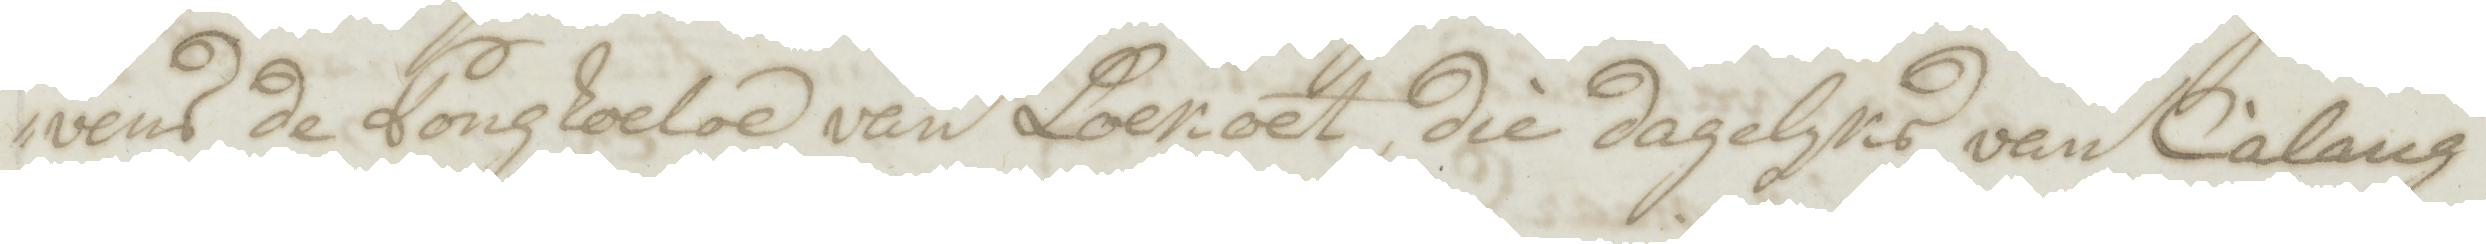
„vens de Ponghoeloe van Loekoet die dagelyks van Calang
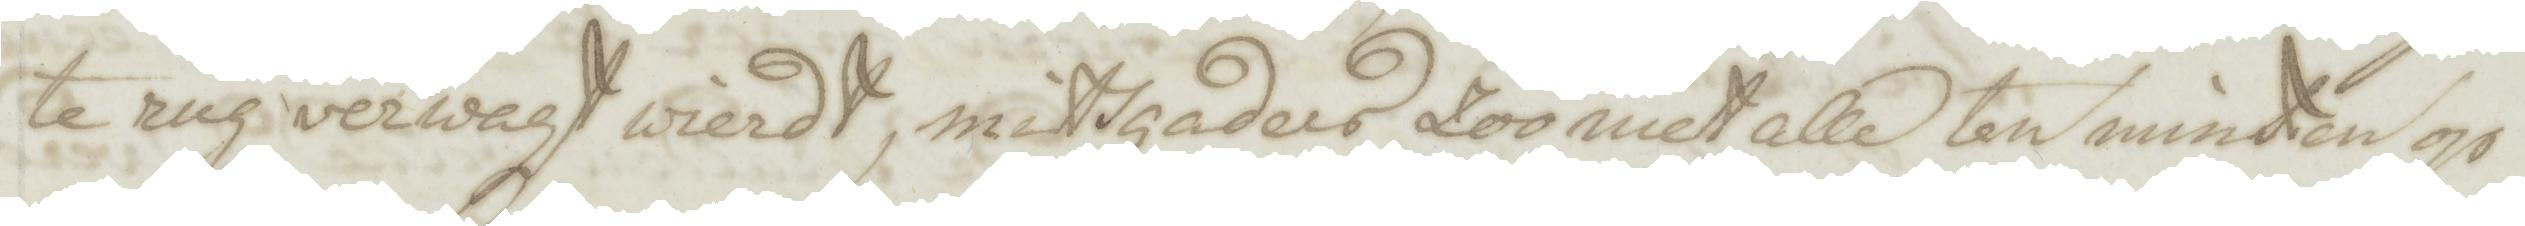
te rug verwagt wierdt, mitsgaders zoo niet alle ten minsten op
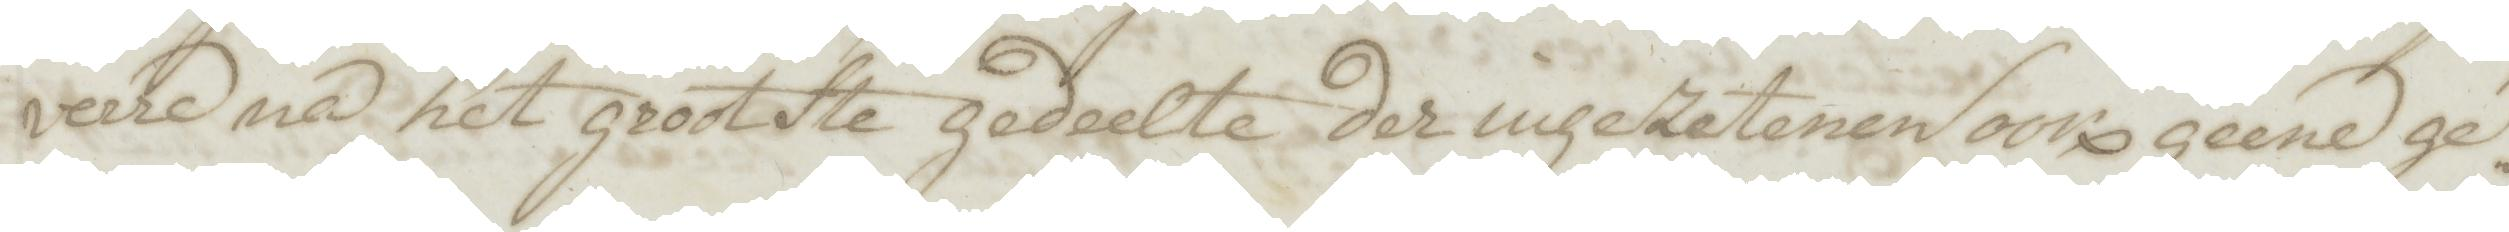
veere na het grootste gedeelte der ingezetenen ook geene ge
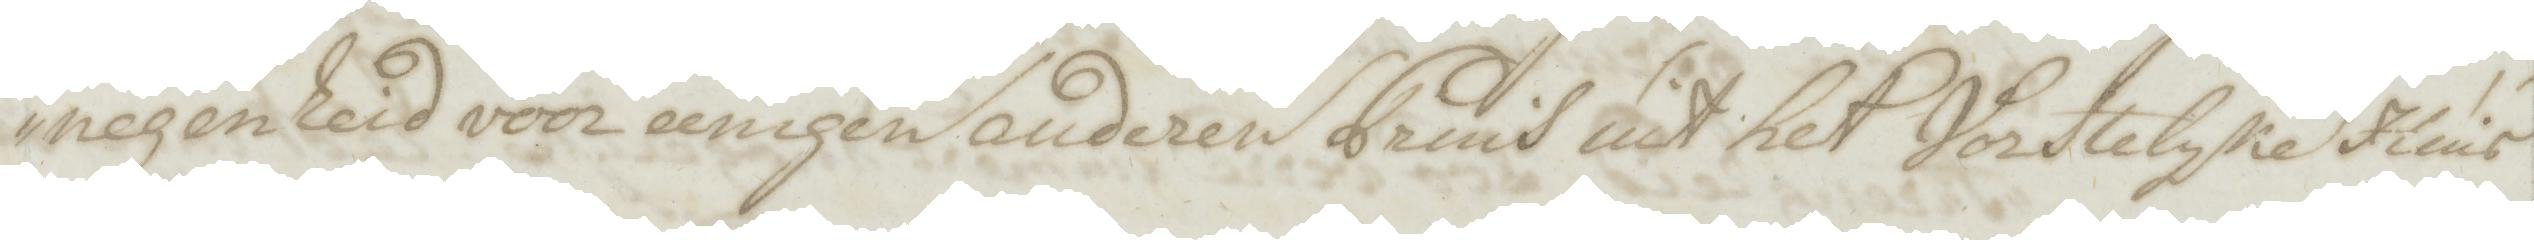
negenheid voor eenigen anderen Prins uit het Vorstelyke Huis
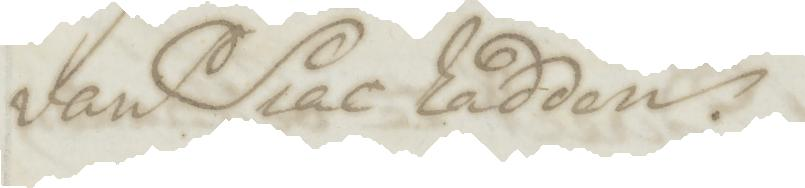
van Siac hadden.
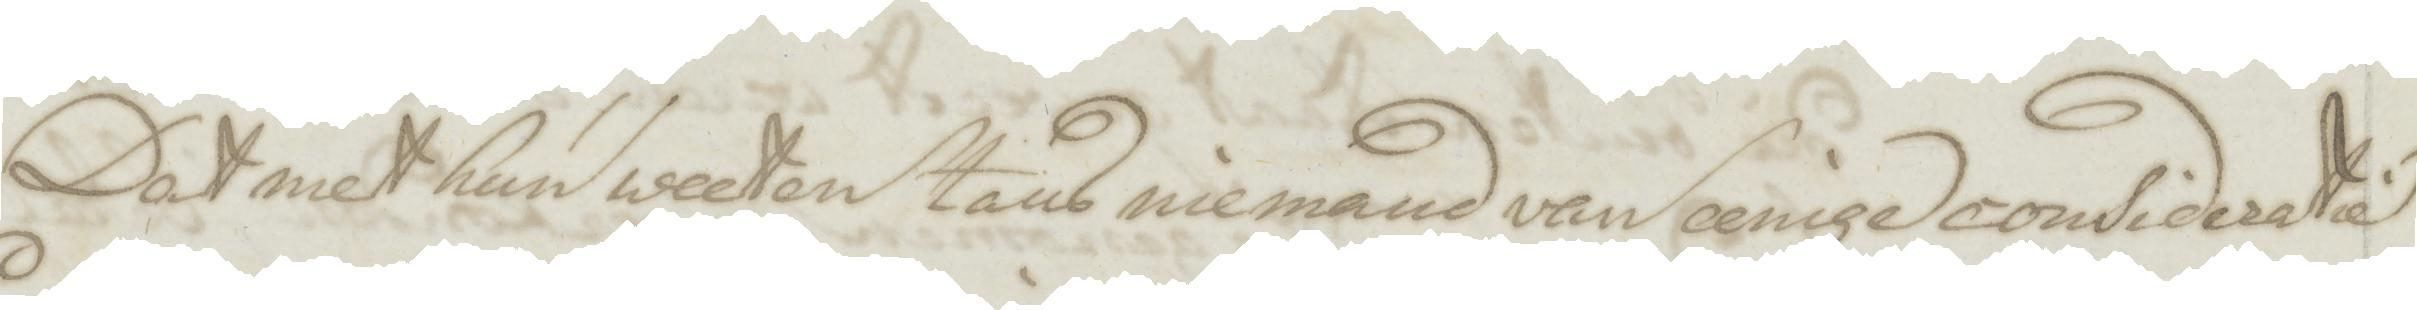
Dat met hun weeten tans niemand van eenige consideratie
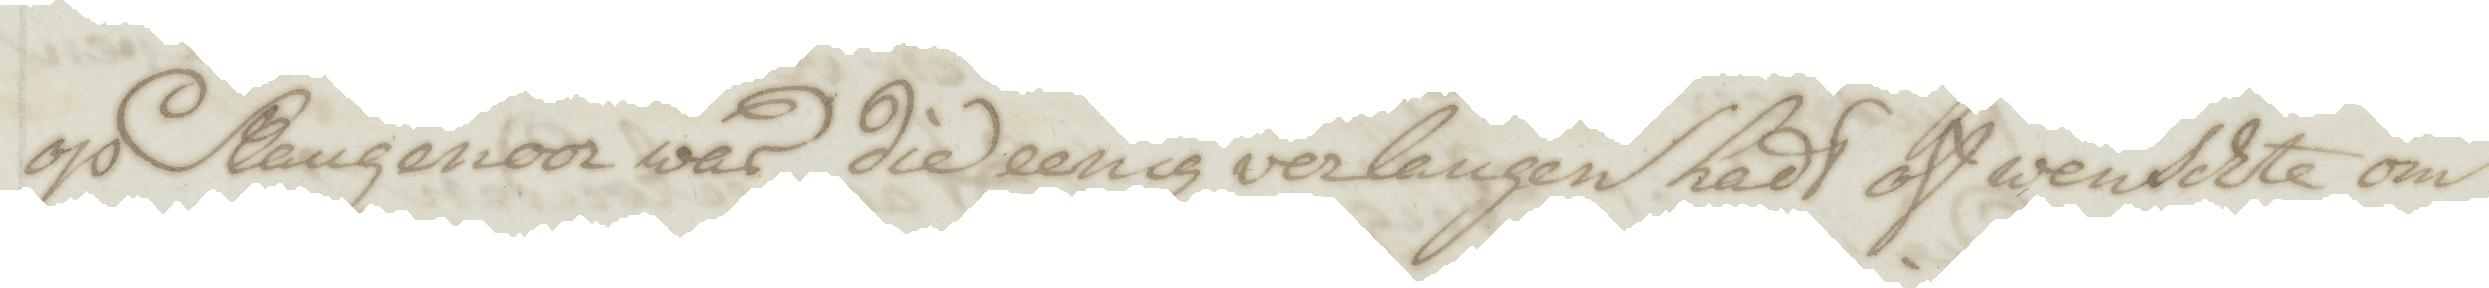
op Slangenoor was die eenig verlangen hads of wenschte om
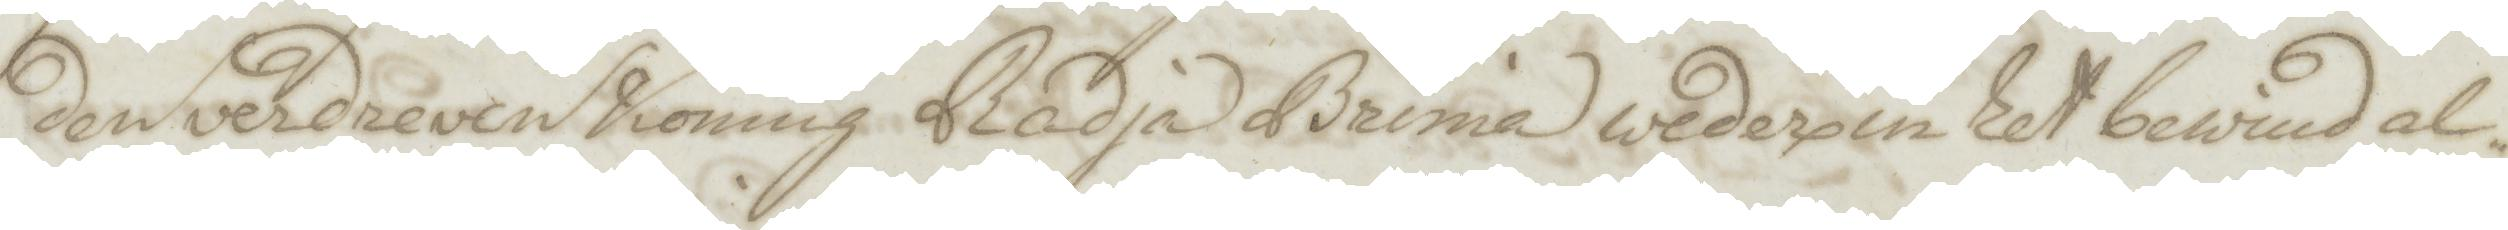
den verdreven koning Radja Brenia weder in het bewind al„
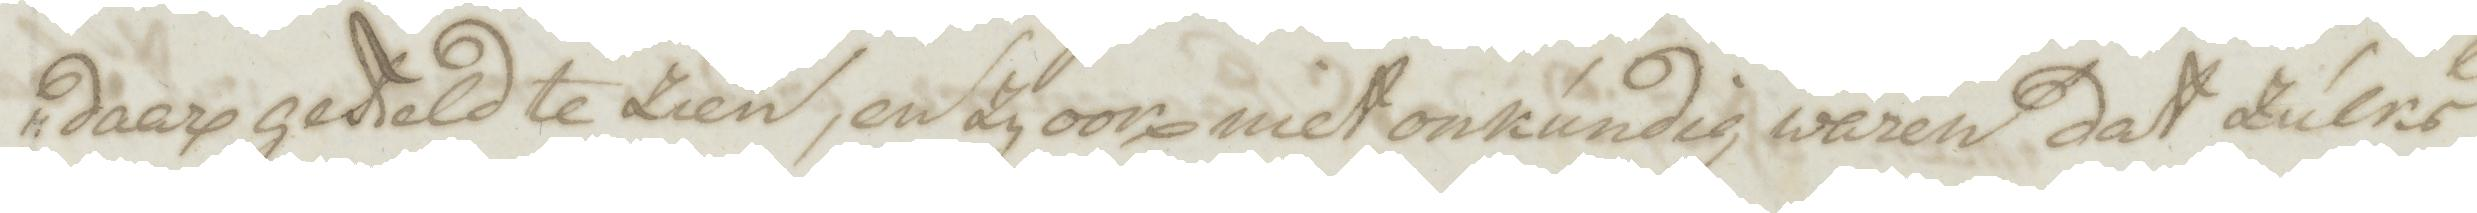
„daar gesteld te zien, en zy ook niet onkundig waren dat zulks
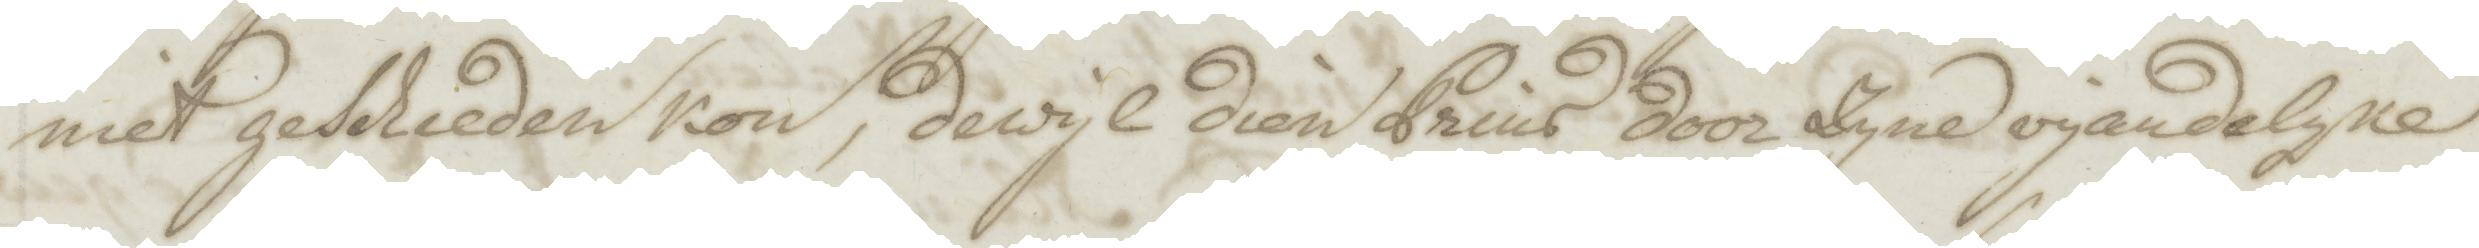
niet geschieden kon, dewijl dien Prins door zyne vijandelyke
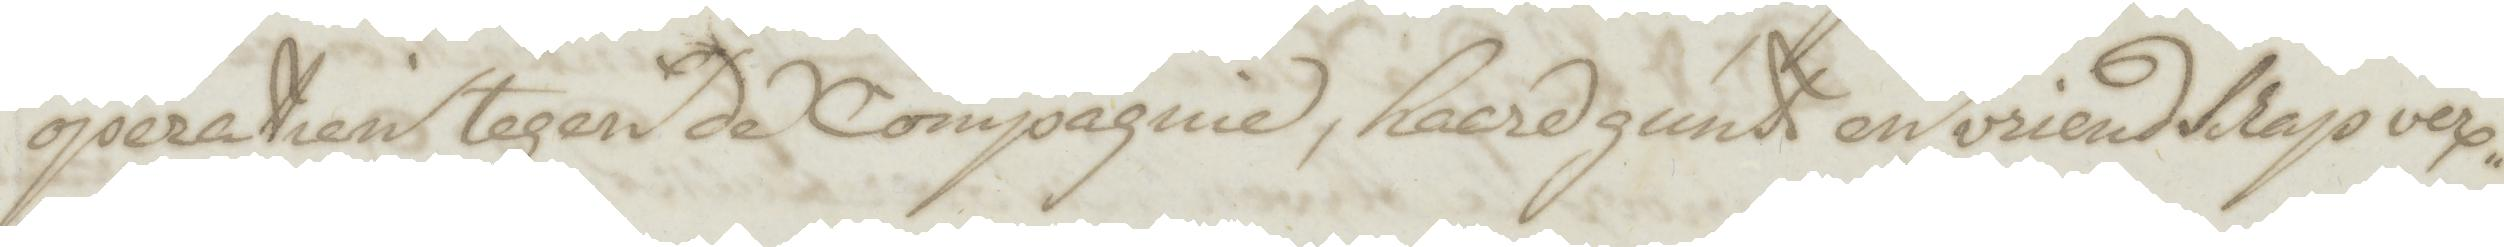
operatien tegen de Compagnie, haere gunst en vriendschap ver„
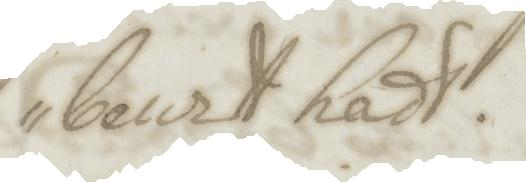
„beurt hadt.
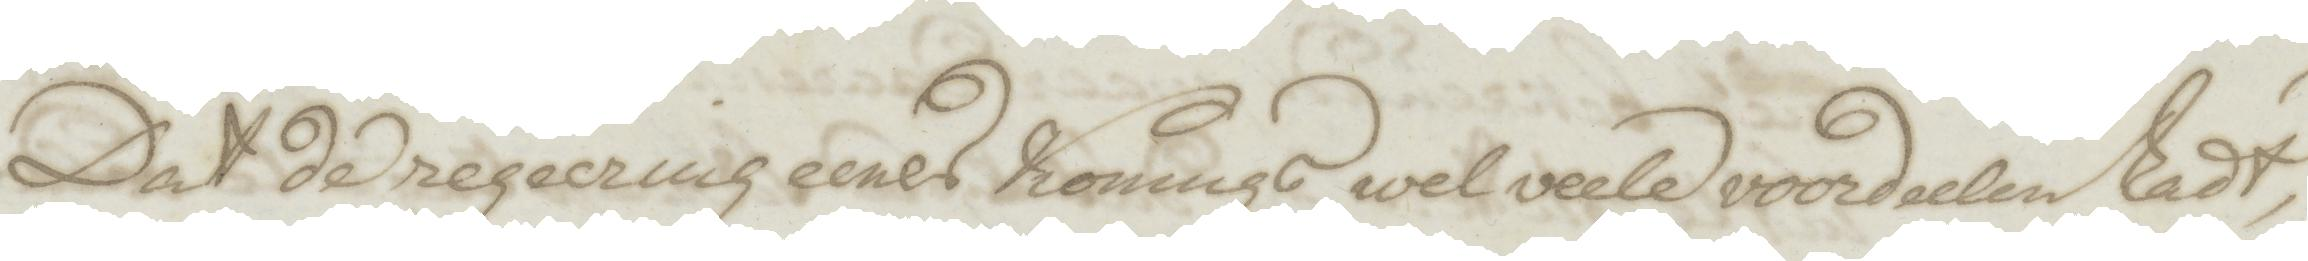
Dat de regeering eenes konings wel veele voordeelen hadt,
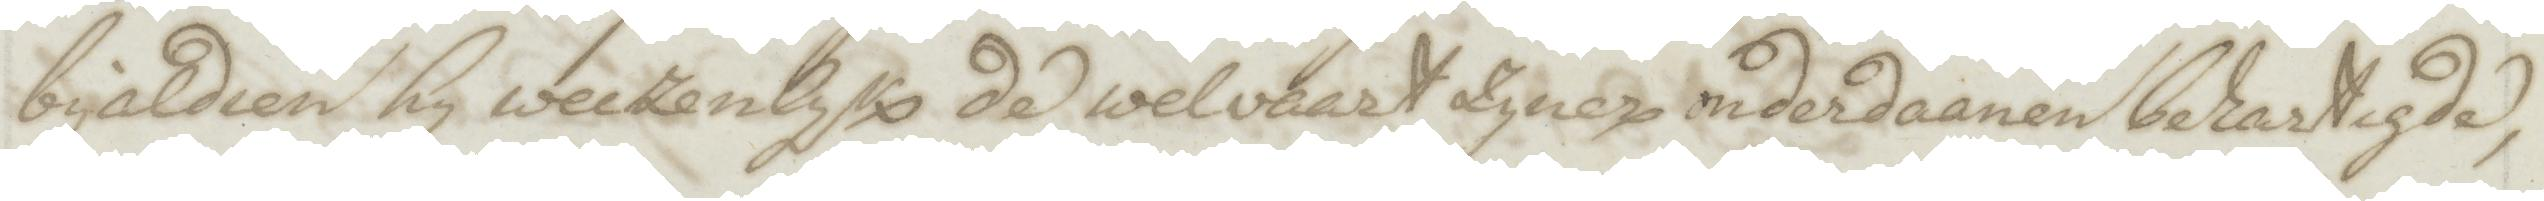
bijaldien hy weezenlijk de welvaart zyner onderdaanen behartigde,
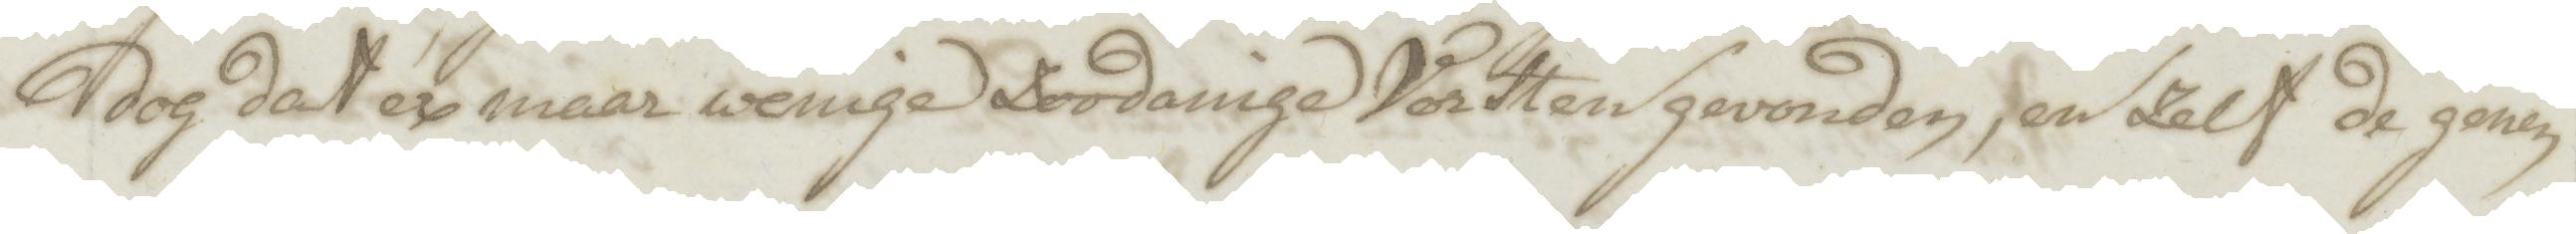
dog dat er maar wenige zoodanige Vorsten gevonden, en zelf de genen
